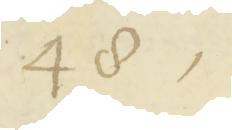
48,
